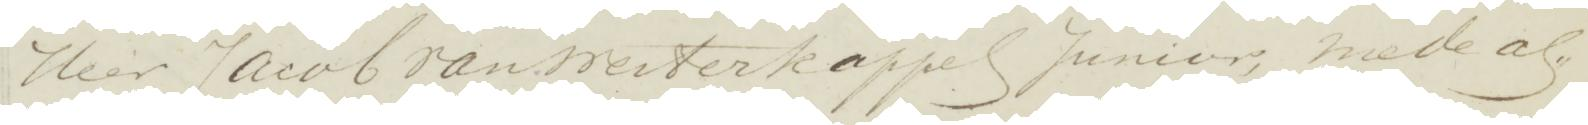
Heer Jacob van Westerkappel Junior, mede al„
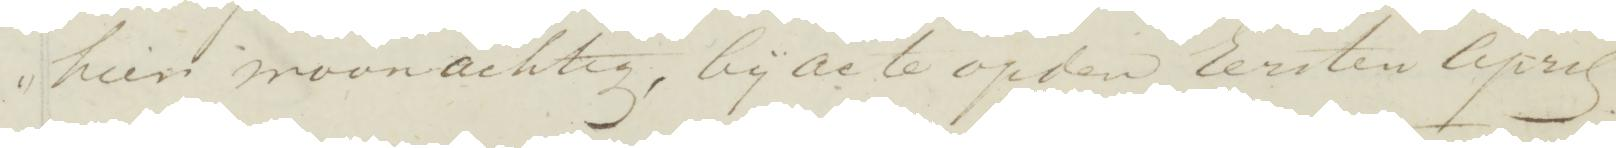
„hier woonachtig, bij acte op den Eersten April
